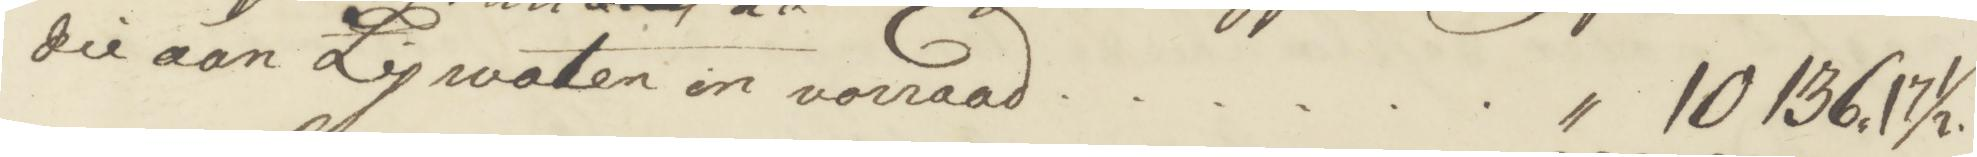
die aan Lijwaten in vorraad . . . . . . „ 10136„ 17½.
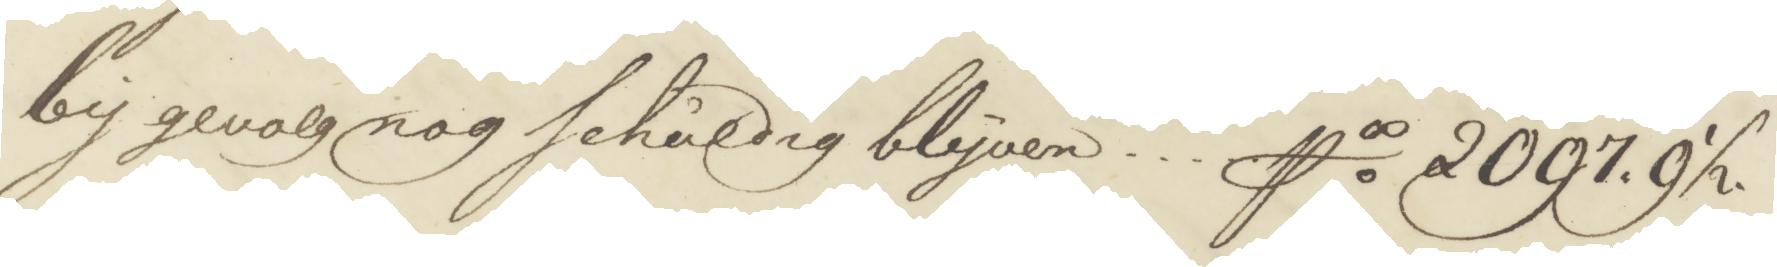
bij gevolg nog schuldig blijven . . . . .p a/o 2097„ 9½.
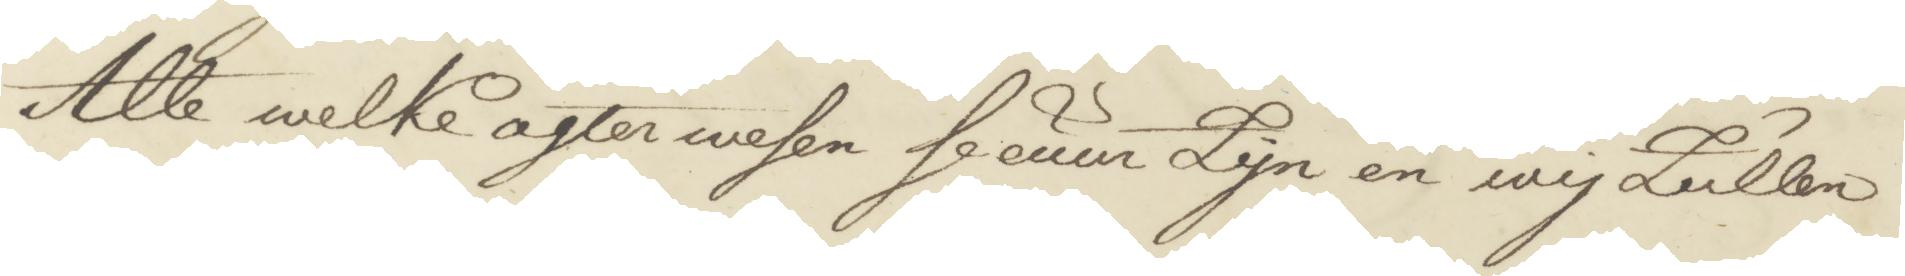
Alle welke agter wesen secuur zijn en wij zullen
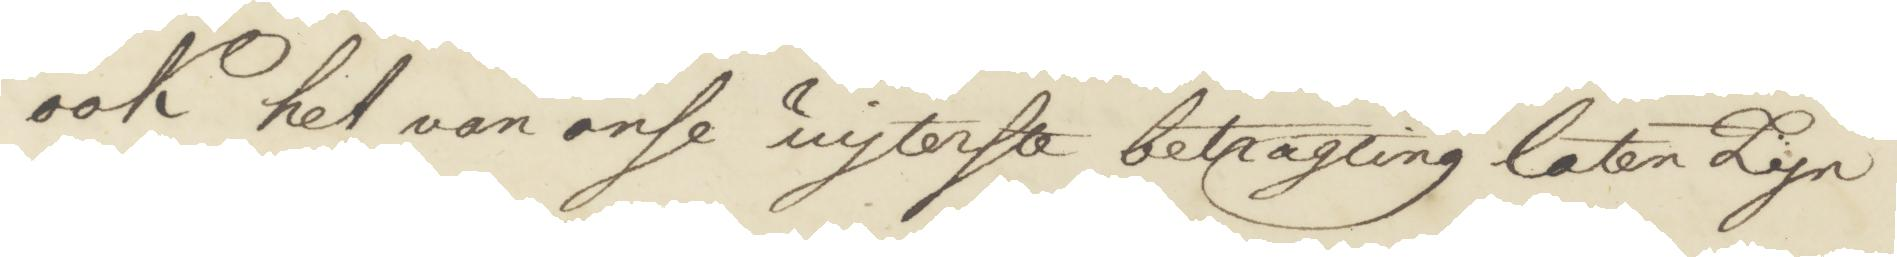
ook het van onse uijterste betragting laten zijn
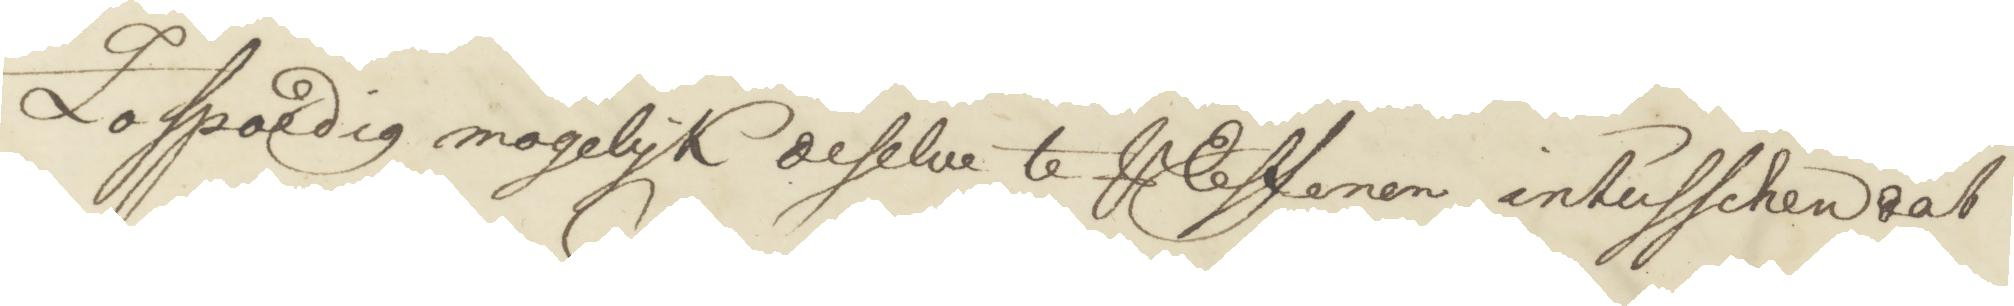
Zo spoedig mogelijk deselve te verEeffenen intusschen dat
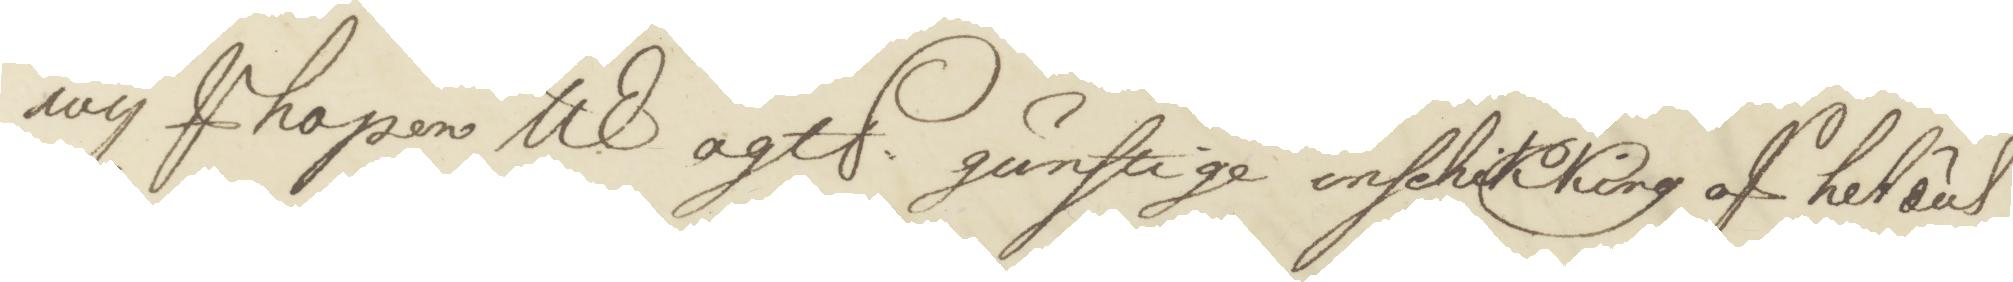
wij verhopen UE agtb: gunstige inschikking of het dus
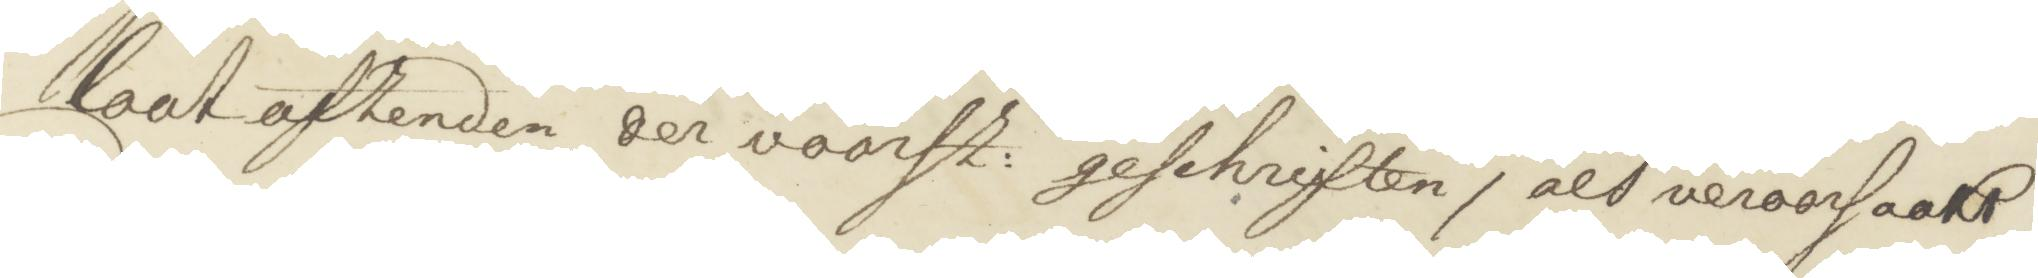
laat afzenden der voorsz: geschriften, als veroorsaakt
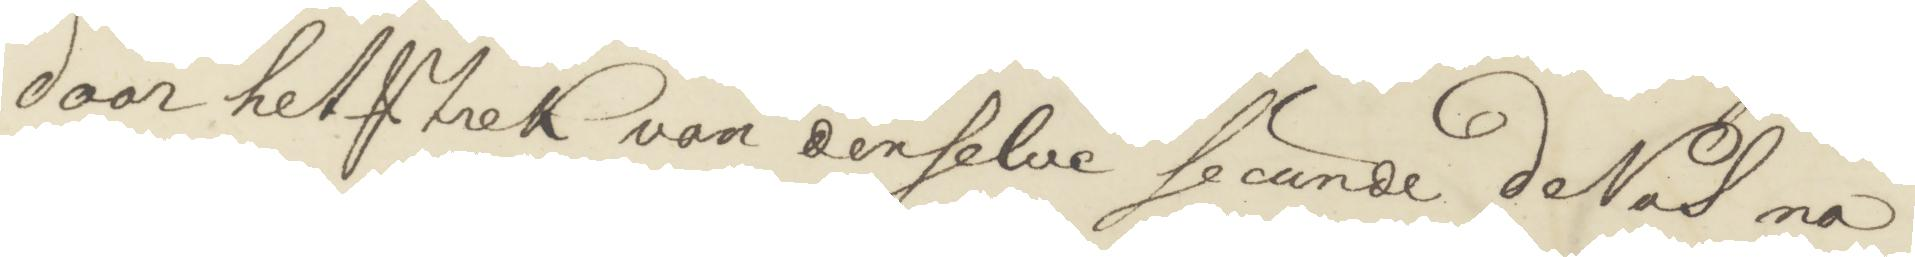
door het vertrek van derselve secunde devas na
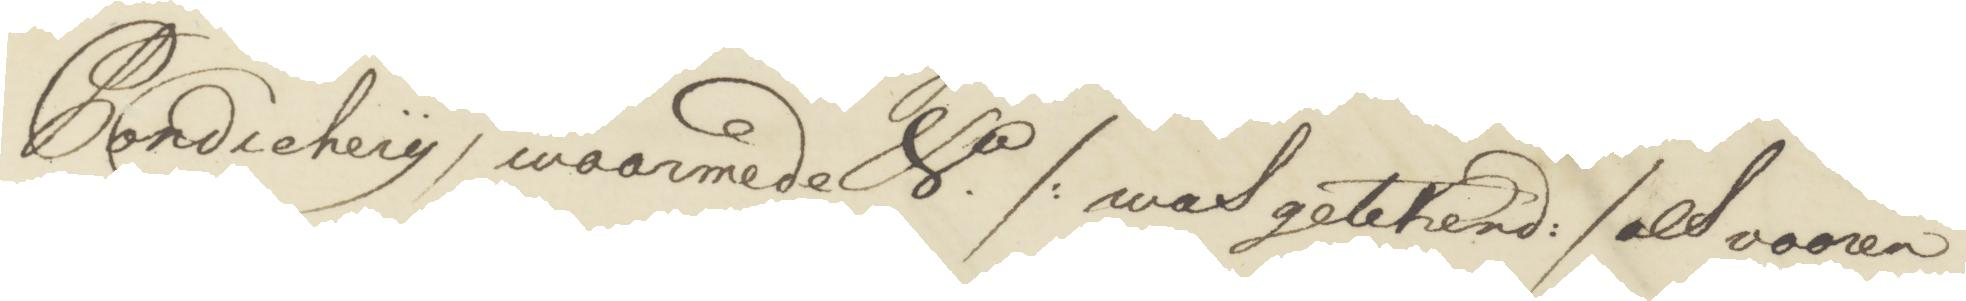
Pondieherij, waarmede &.a /:was getekend:/ als vooren
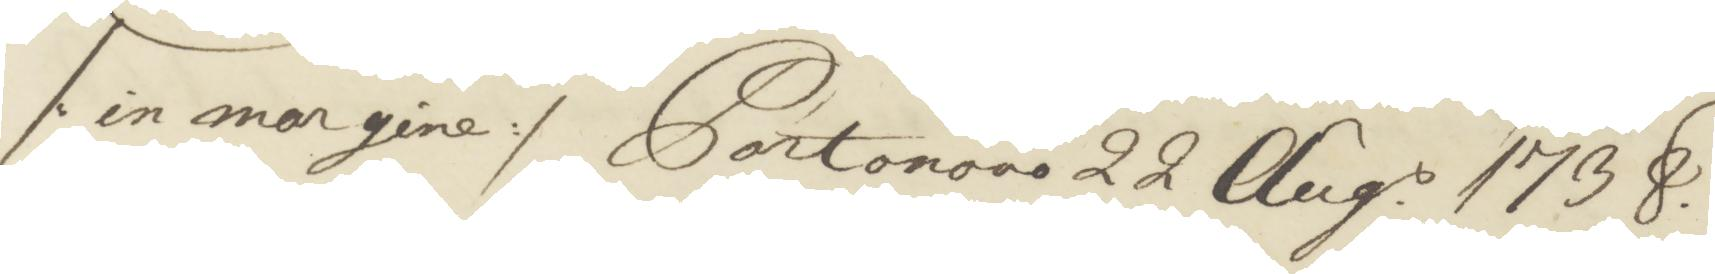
/:in margine:/ Portonovo 22 Aug: 1738.
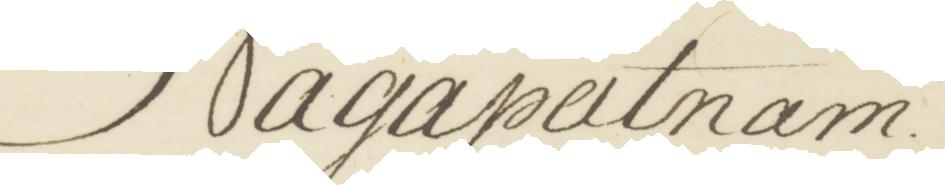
Nagapatnam.
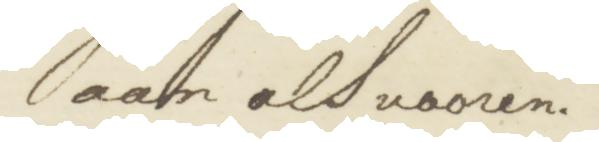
aan als vooren.
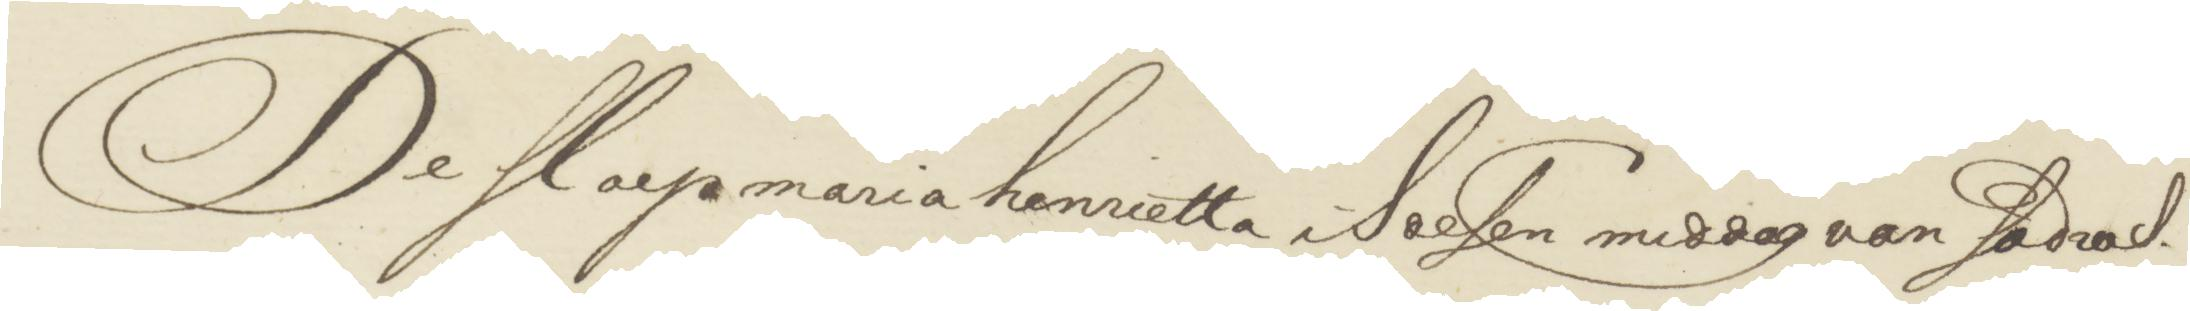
De sloep maria henrietta is desen middag van sadras
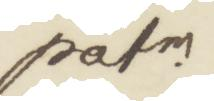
pat,m
